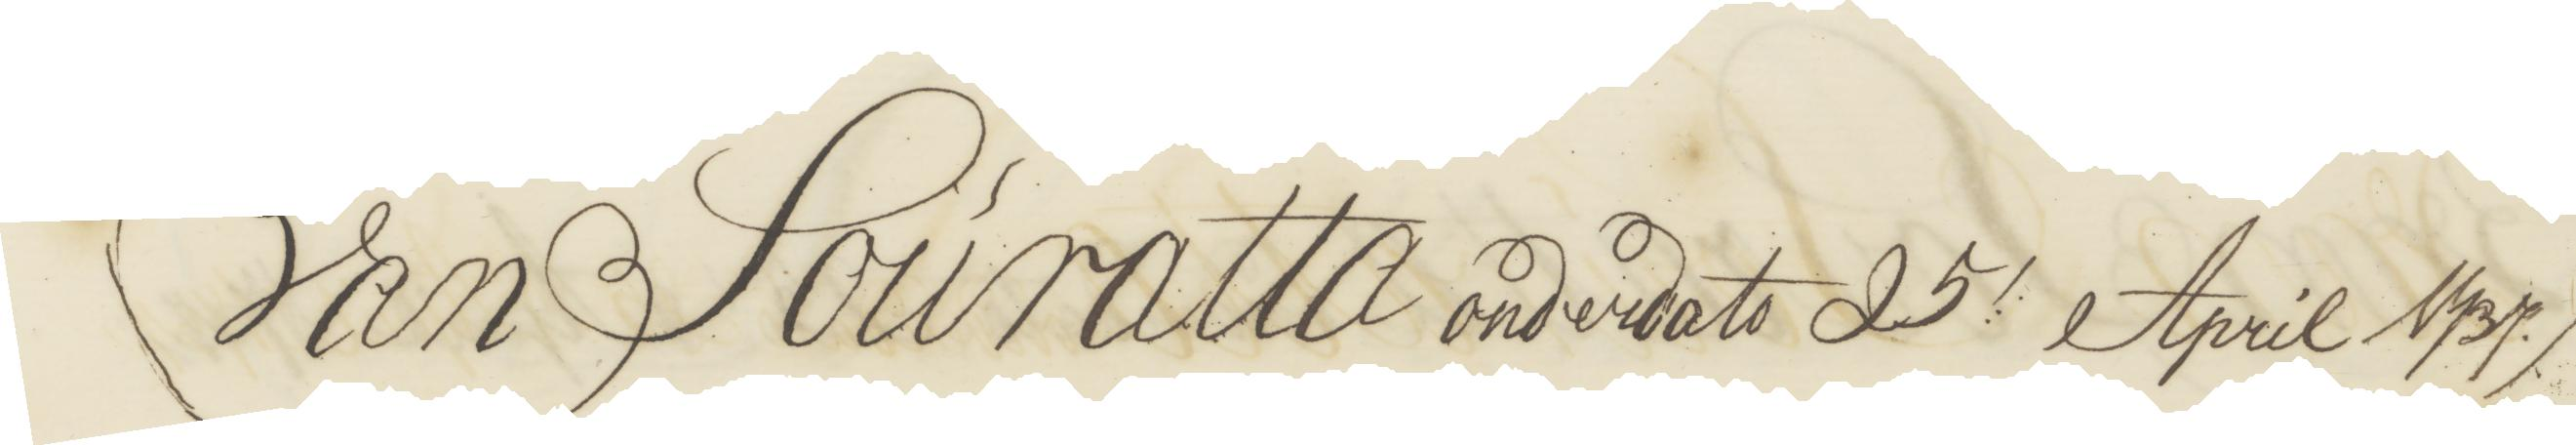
Van Souratta onderdato 25:' April 1737./
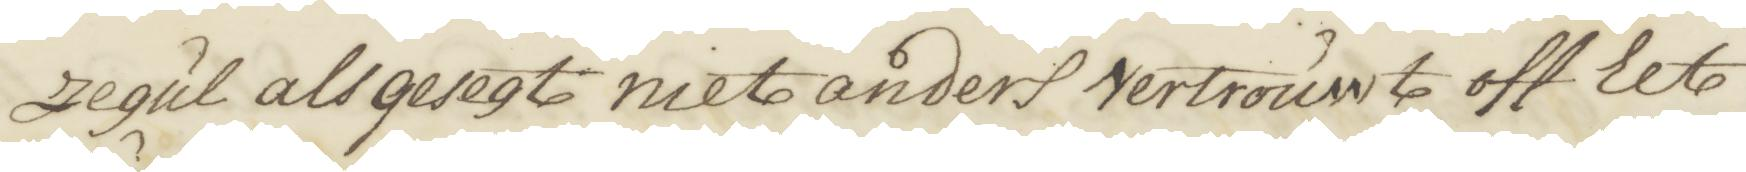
zegul als gesegt niet anders vertrouwt off het
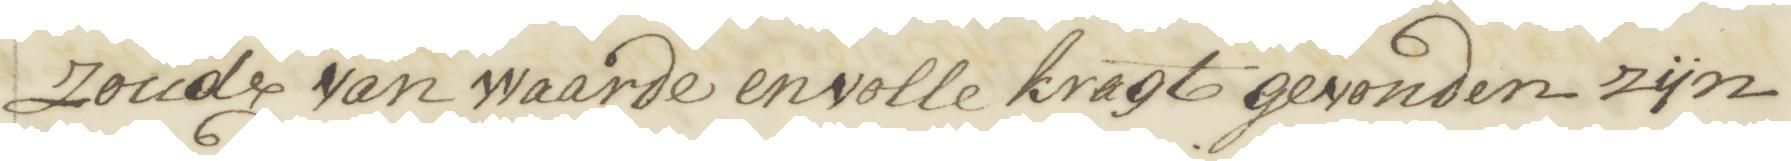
zoude van waarde en volle kragt gevonden zijn
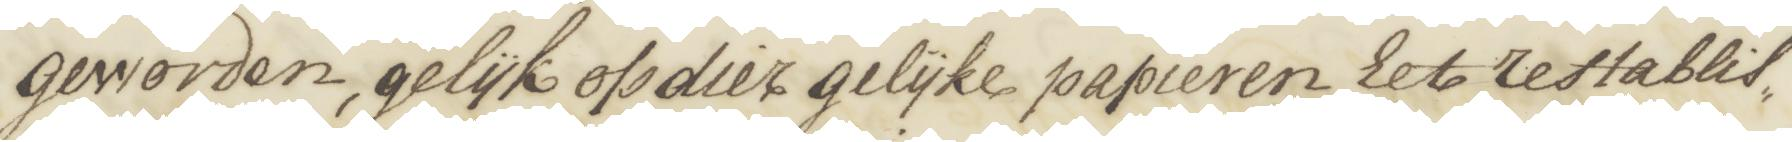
geworden, gelijk op dier gelijke papieren het restablis„
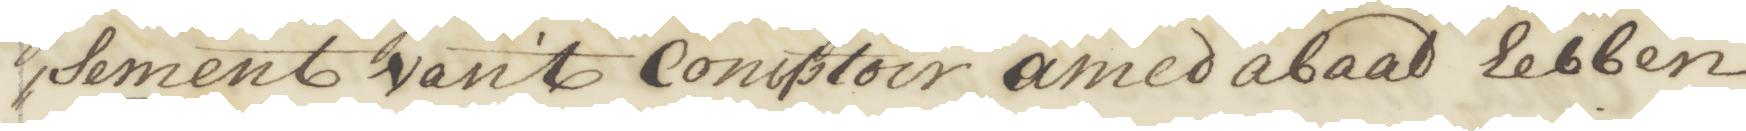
„sement van’t Comptoir amed abaad hebben
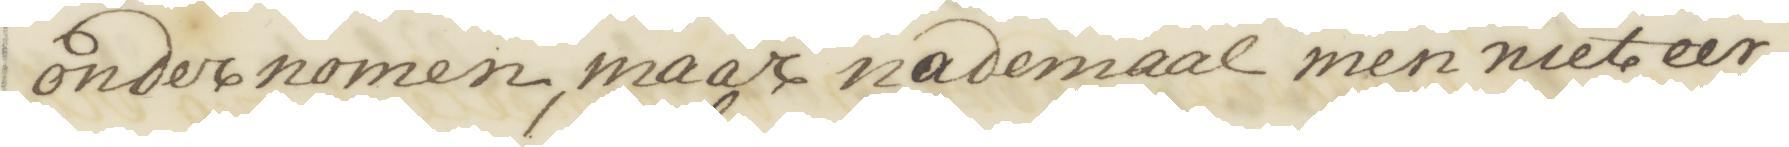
onder nomen, maar nademaal men niet eer
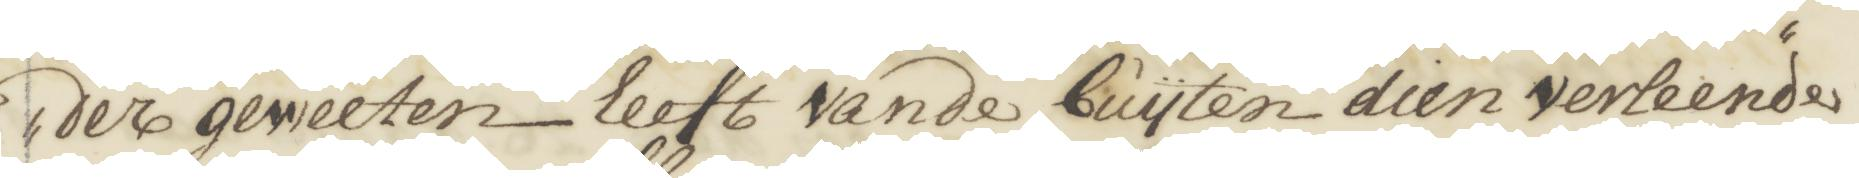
„der geweeten heeft vande buijten dien verleende
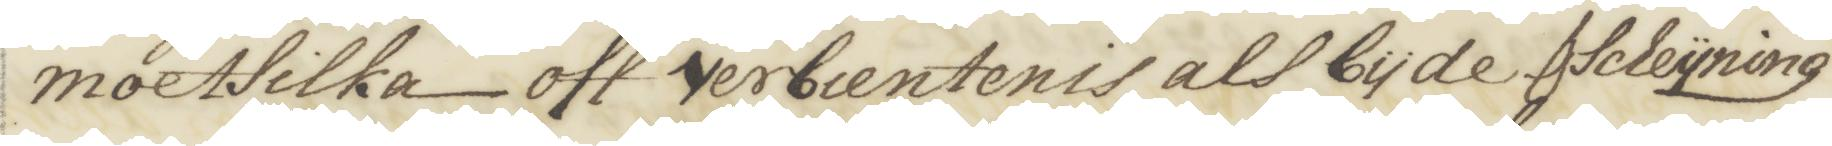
moetsilka off verbientenis als bij de verscheijning
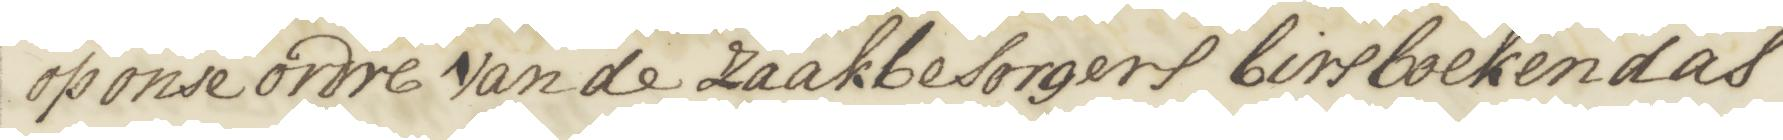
op onse ordre van de zaakbesorgers birsboeken das
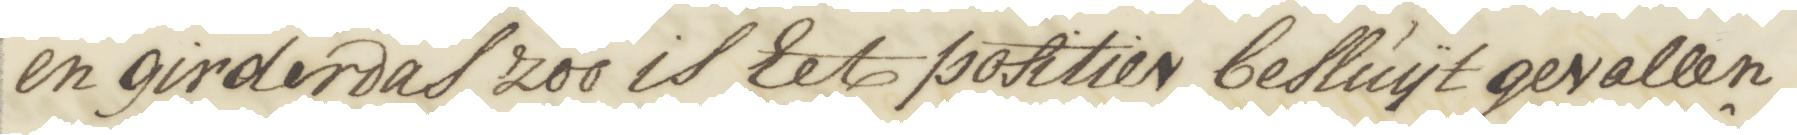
en girderdas, zoo is het positien besluijt gevallen
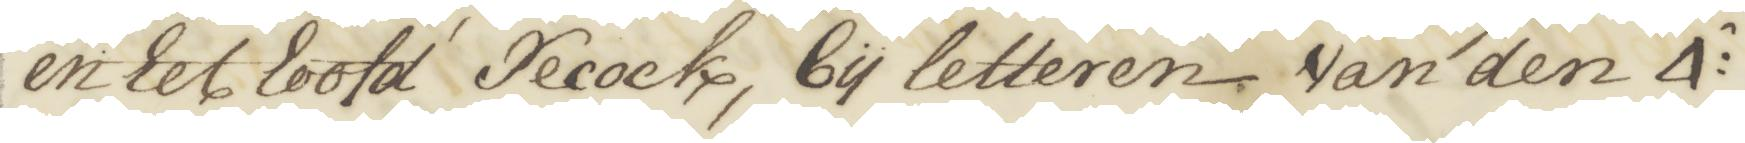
en het hoofd Pecock, bij letteren van den 4:'
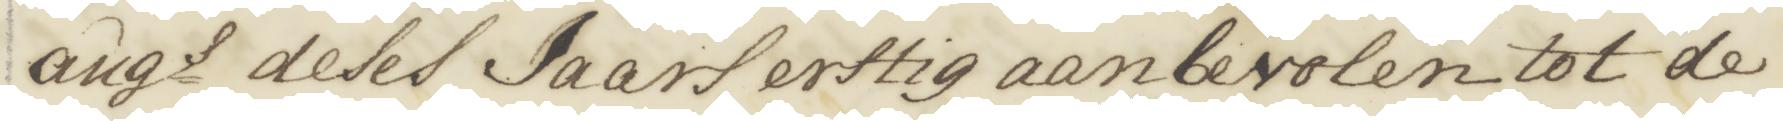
aug=s deses Iaars erstig aan bevolen tot de
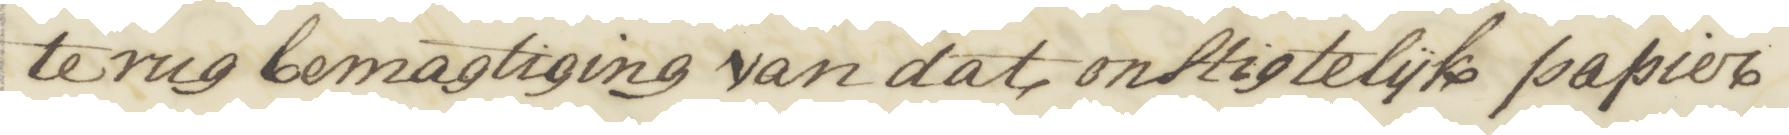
te rug bemagtiging van dat onstigtelijk papier
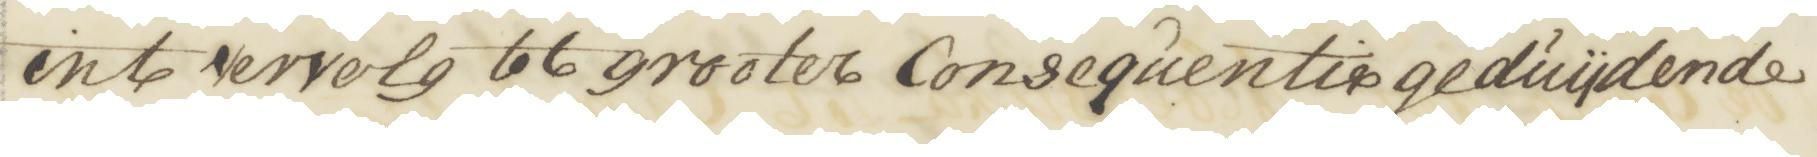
int vervelg tot grooter Consequentie geduijdende
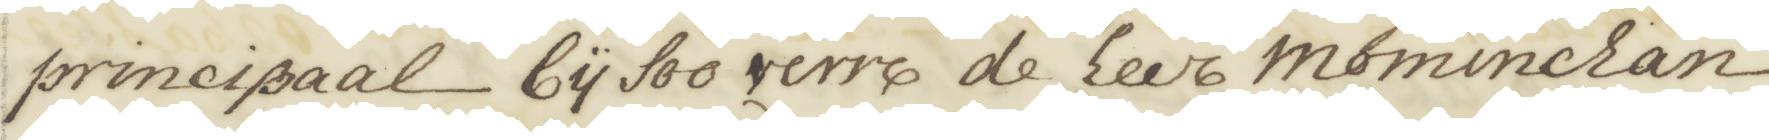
principaal bij soo verre de heer mominchan,
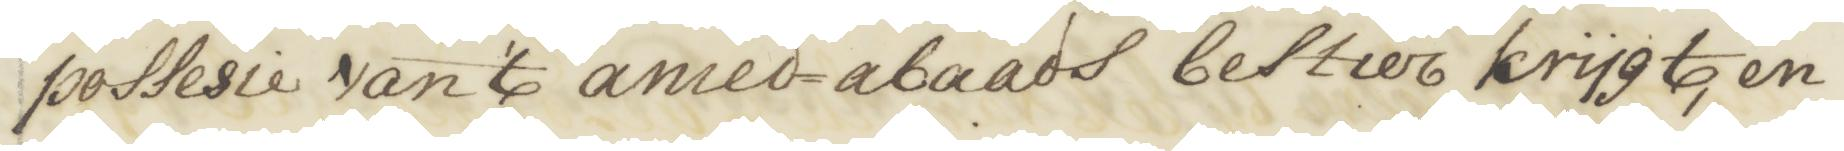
possesie van ’t amed=abaads bestier krijgt, en
